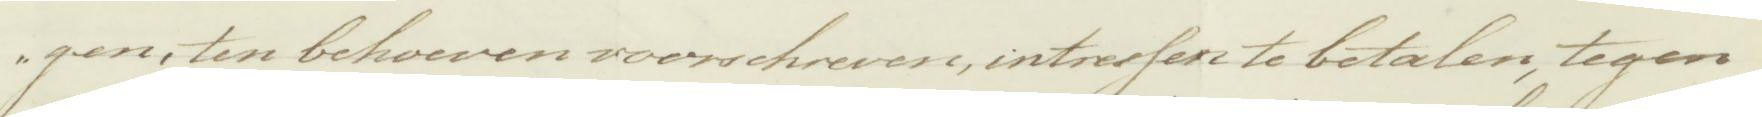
„gen, ten behoeven voorschreven, intressen te betalen, tegen
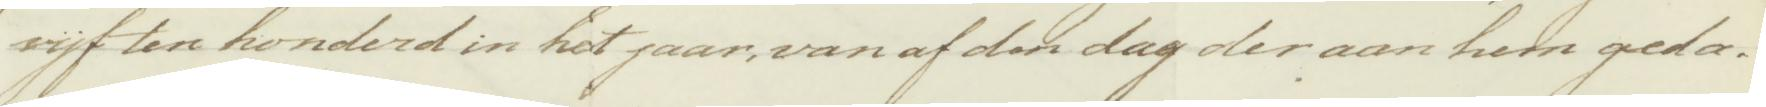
vijf ten honderd in het jaar, van af den dag der aan hem geda„
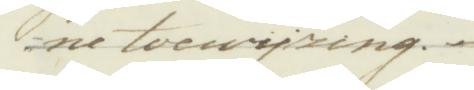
=ne toewijzing.
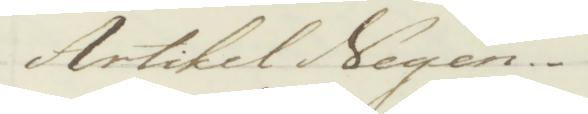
Artikel Negen. -
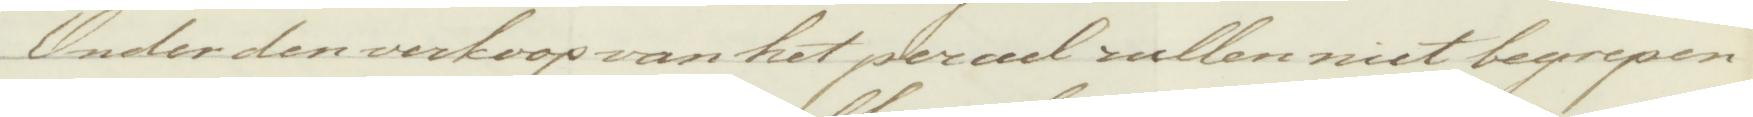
Onder den verkoop van het perceel zullen niet begrepen
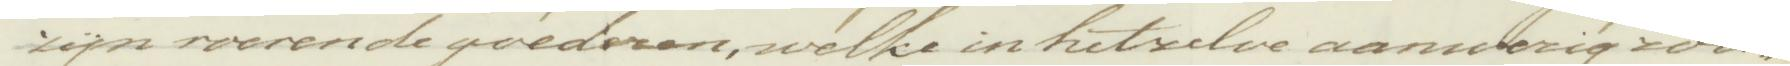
zijn roerende goederen, welke in hetzelve aanwezig zou„
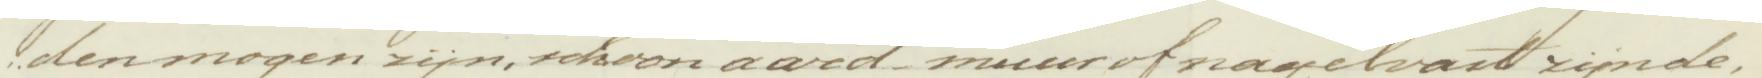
„den mogen zijn, schoon aard muur of nagelvast zijnde,
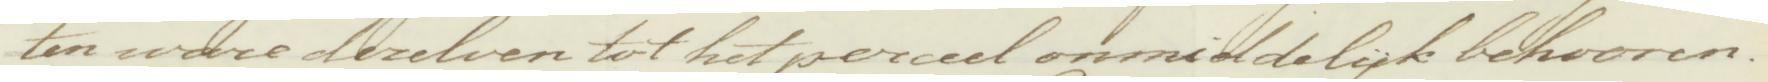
ten ware dezelven tot het perceel onmiddelijk behooren.
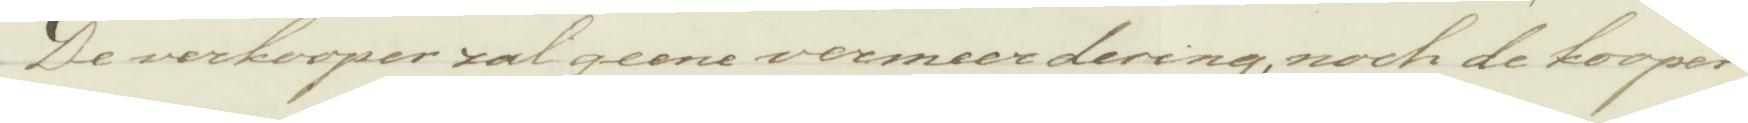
De verkooper zal geene vermeerdering, noch de kooper
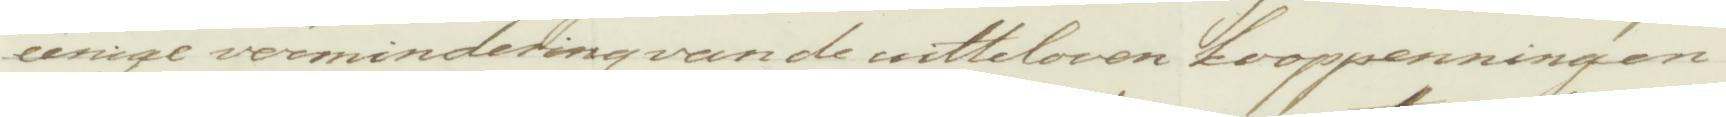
eenige vermindering van de uitteloven kooppenningen
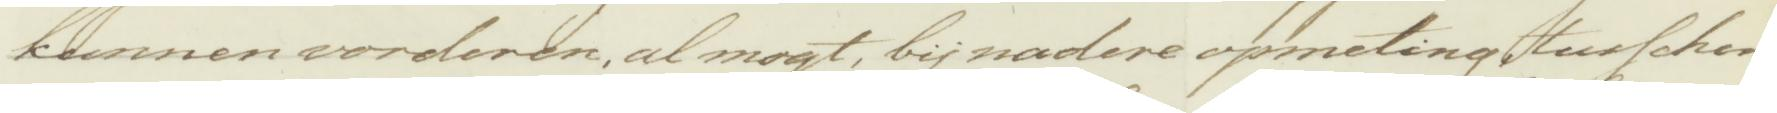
kunnen vorderen, al mogt, bij nadere opmeting tusschen
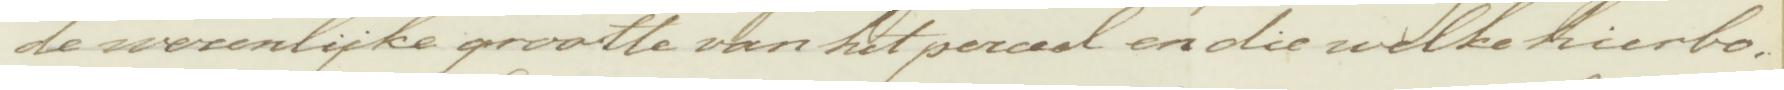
de wezenlijke grootte van het perceel en die welke hierbo„
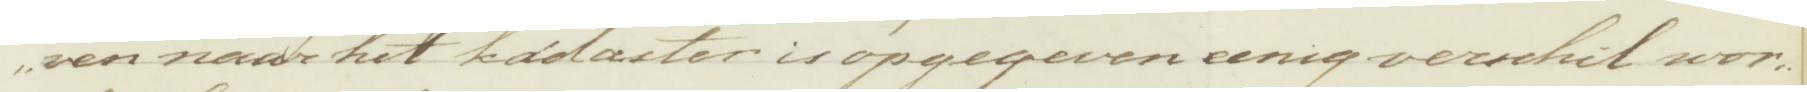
„ven naar het kadaster is opgegeven eenig verschil wor„
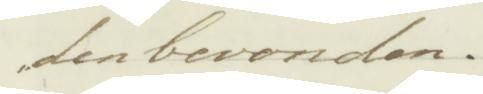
„den bevonden.
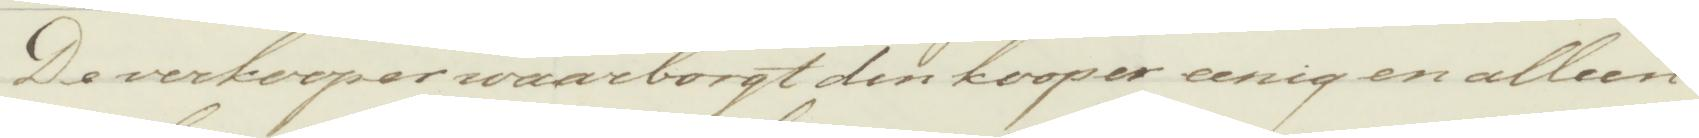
De verkooper waarborgt den kooper eenig en alleen
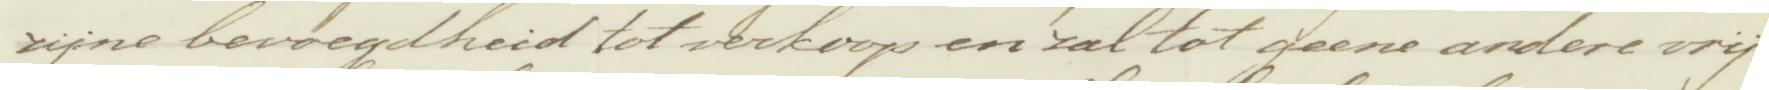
zijne bevoegdheid tot verkoop en zal tot geene andere vrij
